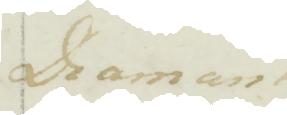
Diamant
